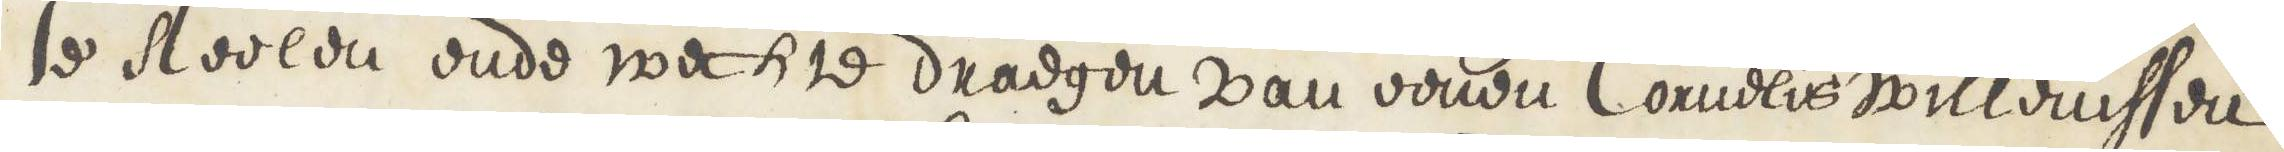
te steelen ende wech te draegen van eenen Cornelis Willemssen
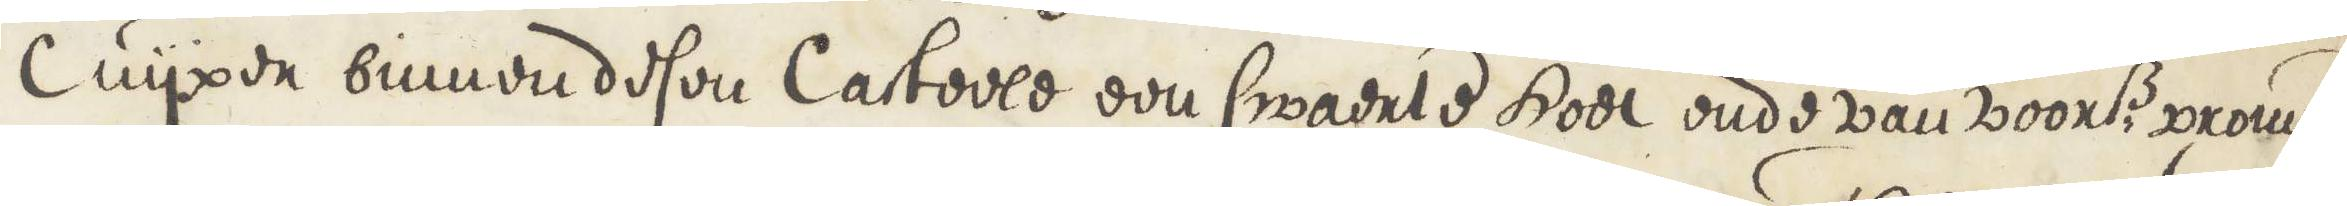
Cuijper binnen desen Casteele een swaerte hoet ende van voors=z vrouw
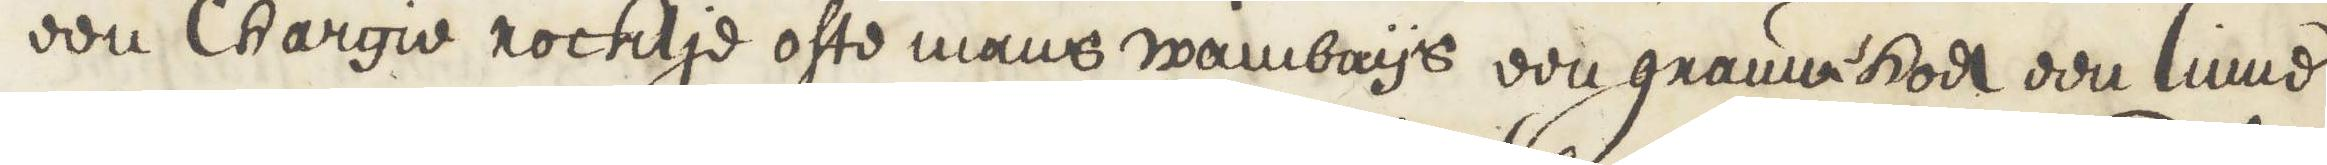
een Chargie rocktje ofte mans wambaijs een grauw hoet een tinne
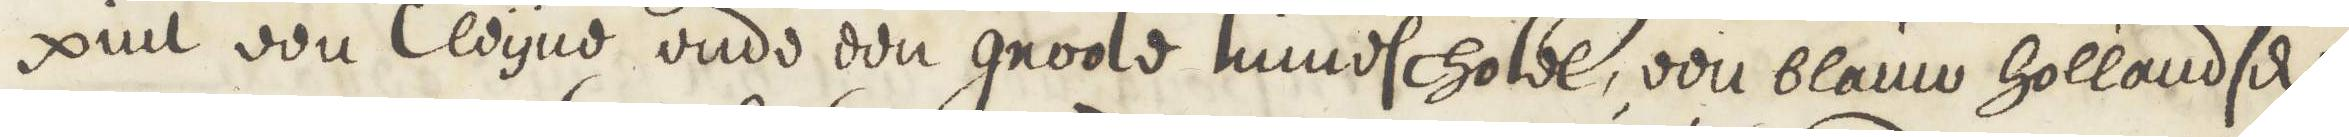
pint een Cleijne ende een groote tinneschotel, een blauw hollandsche
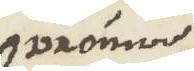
vrouwe
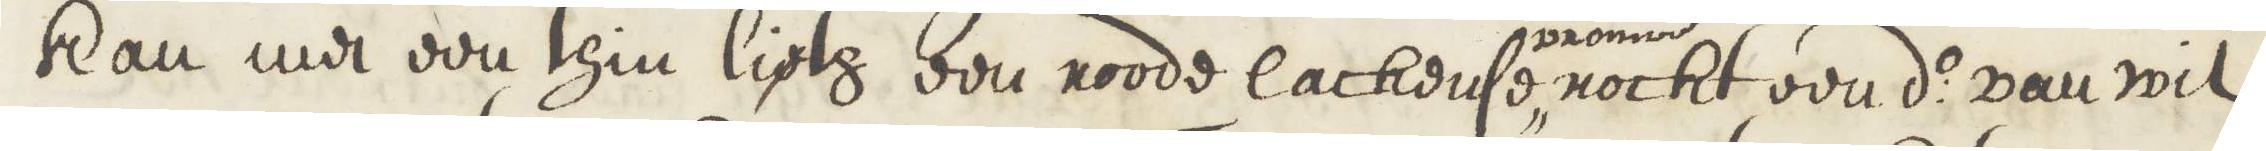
kan met een thin lieth een roode lackense„ rockt een d:o van wit
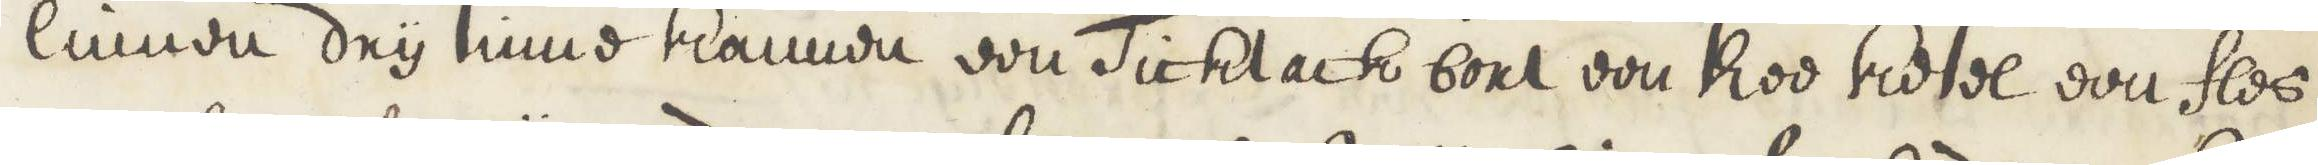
linnen drij tinne kannen een Ticktack bort een thee ketel een fles
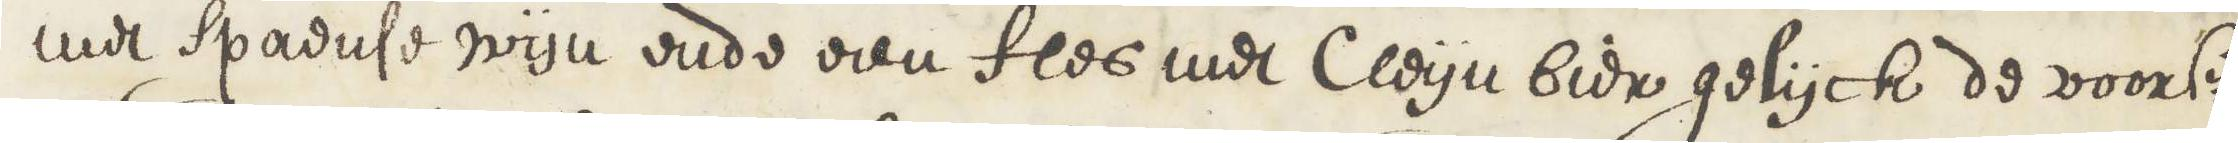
met spaense wijn ende een fles met Cleijn bier gelijck de voors=z
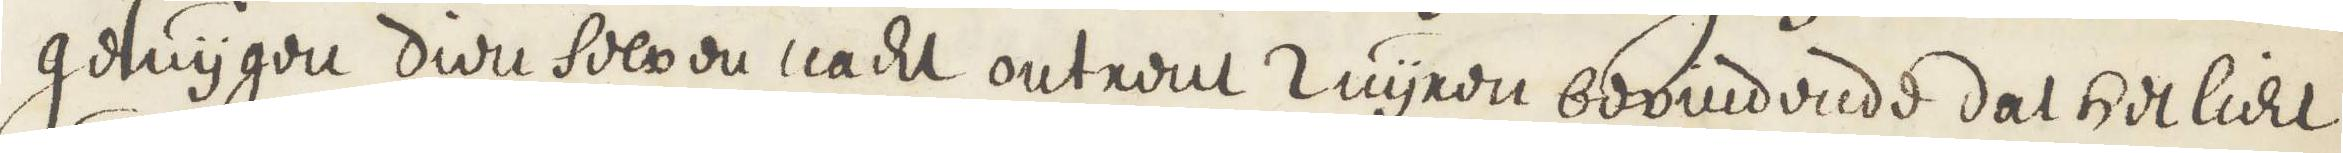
getuijgen dien selven nacht ontrent 2 uijren bevindende dat het licht
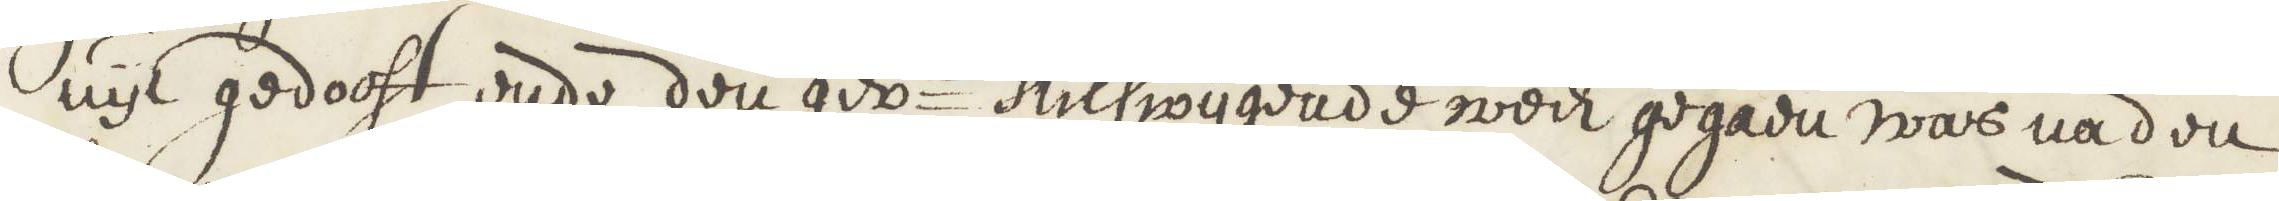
uijt gedooft ende den gev=n stilswijgende wech gegaen was na den
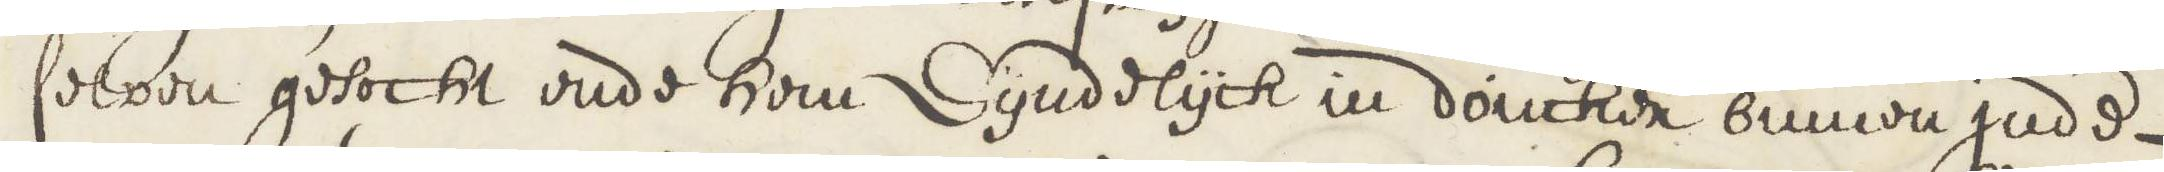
selven gesocht ende hem Eijndelijck in doncker binnen jnde-
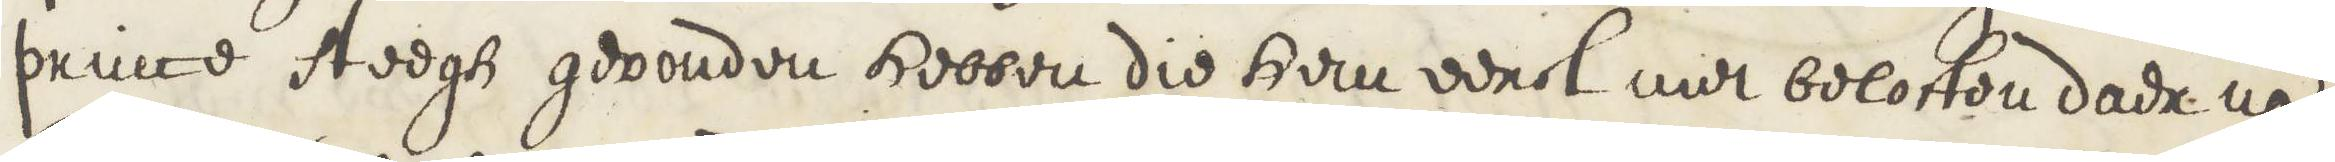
prince steegh gevonden hebben die hem eerst met beloften daer na
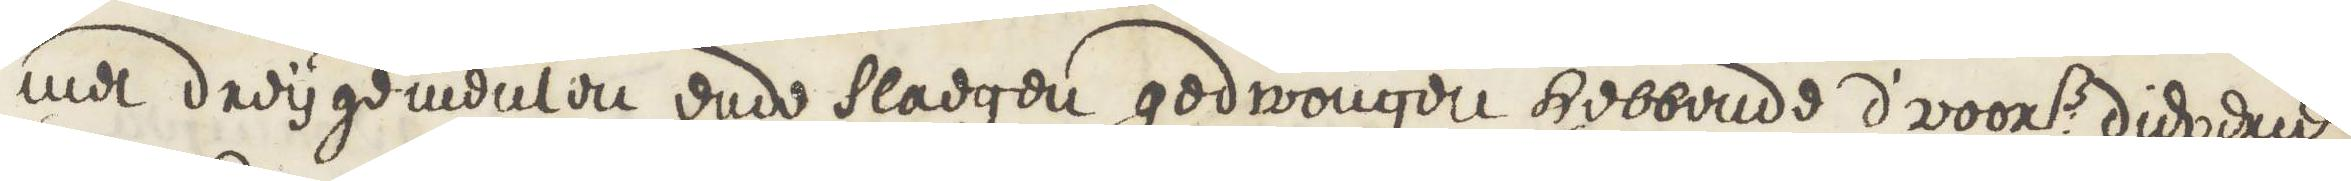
met dreijgementen ende slaegen gedwongen hebbende d’ voors:z dieverie
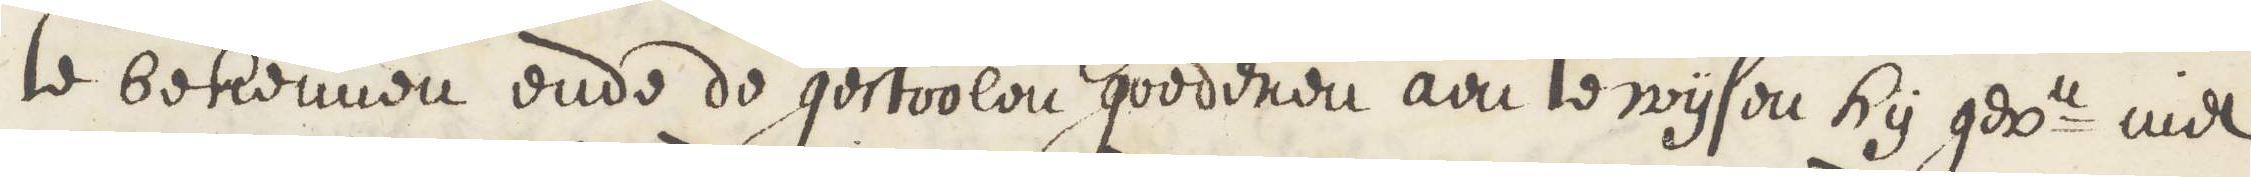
te bekennen ende de gestoolen goederen aen te wijsen hij gev=n met
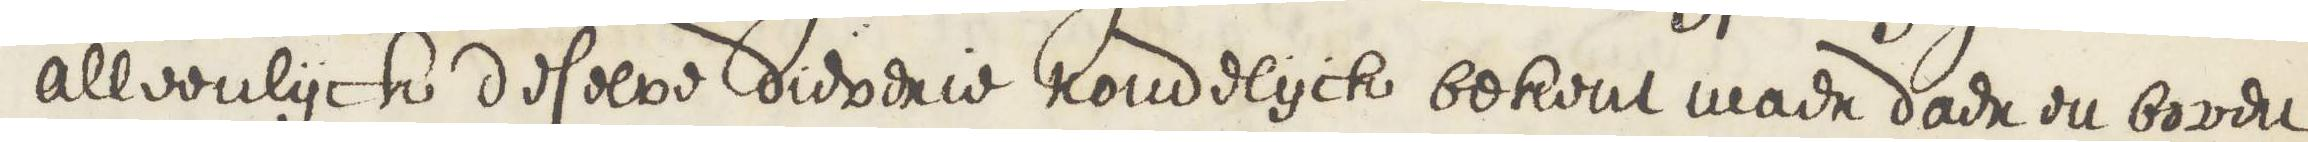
alleenlijck deselve dieverie rondelijck bekent maer daer en boven
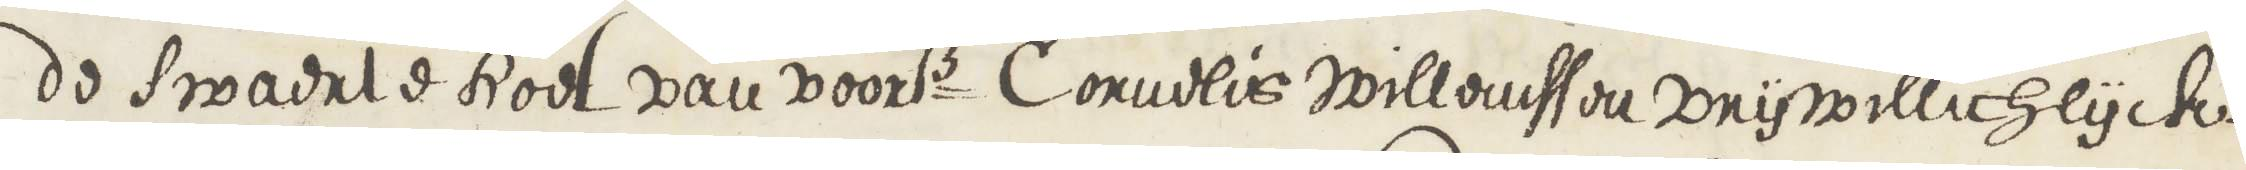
de swaerte hoet van voors=z Cornelis Willemssen vrijwillichlijck
